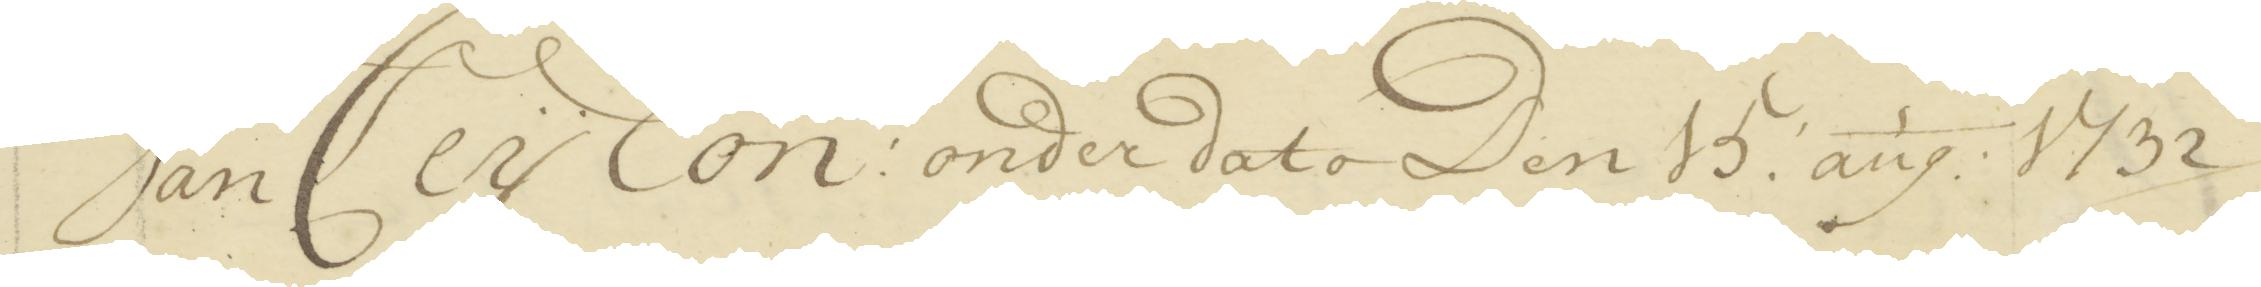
Van Ceijlon: onder dato Den 15:e aug: 1732
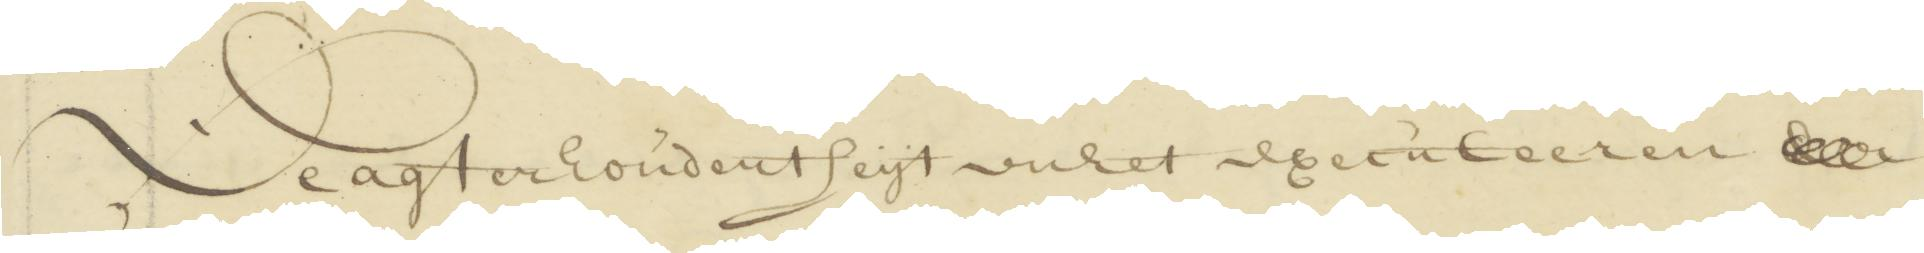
De agterhoudertheijt en het executeeren het
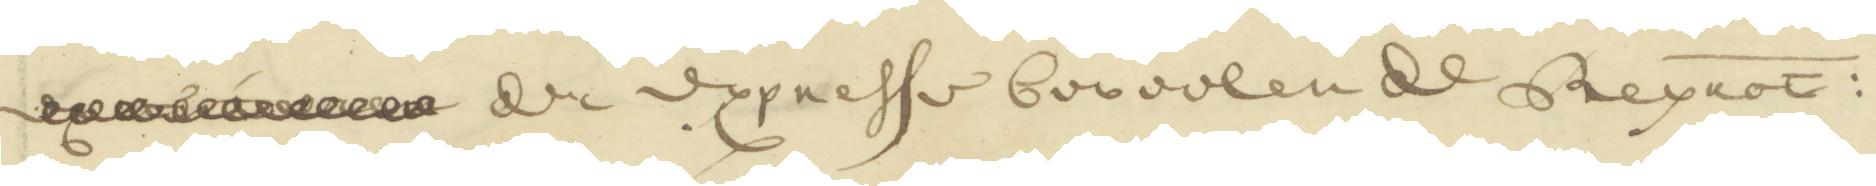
executeeren der expresse beveelen de Reproc:
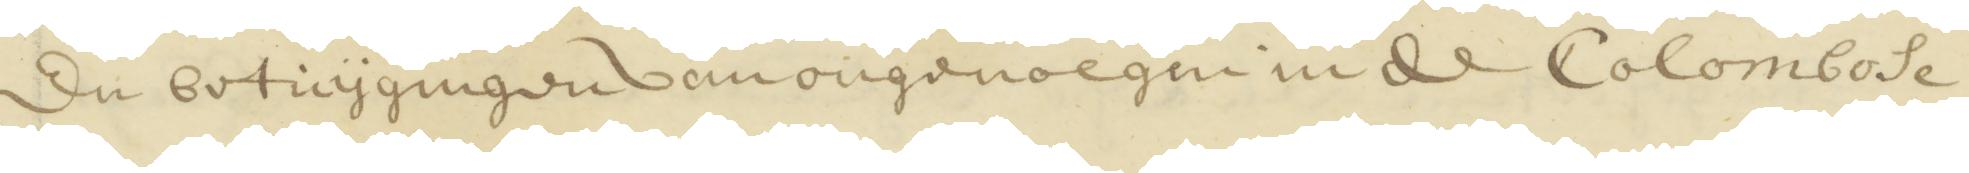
En betuijgingen van ongenoegen in de Colombose
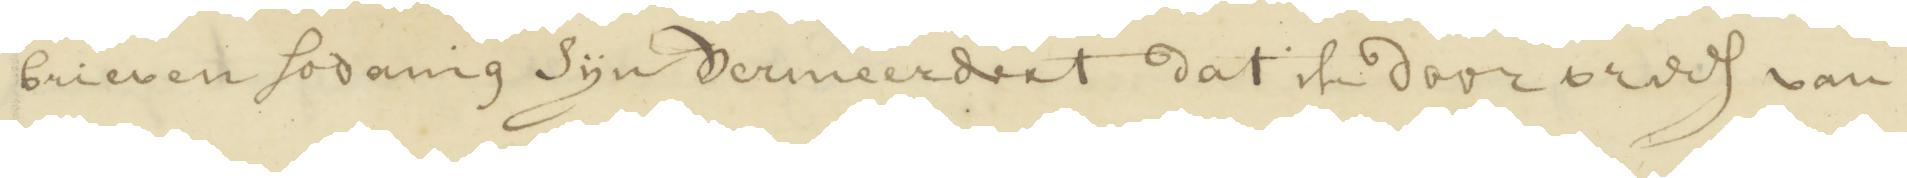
brieven Sodanig Sijn vermeerdert dat ik door vrees van
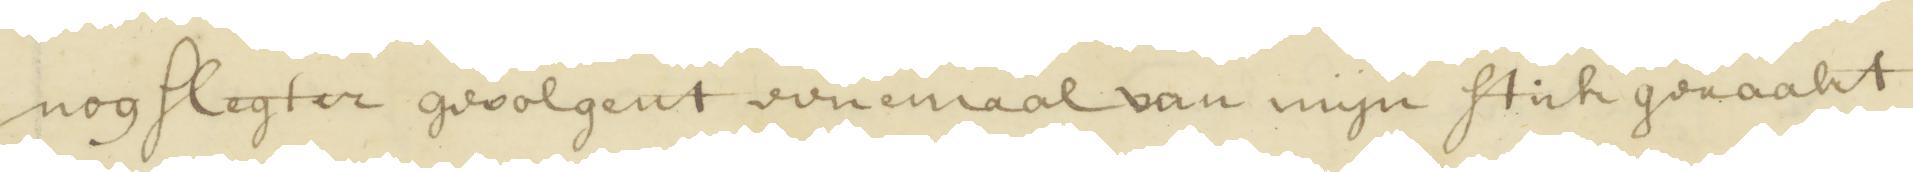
nog Slegter gevolgent eenemaal van mijn Stuk geraakt
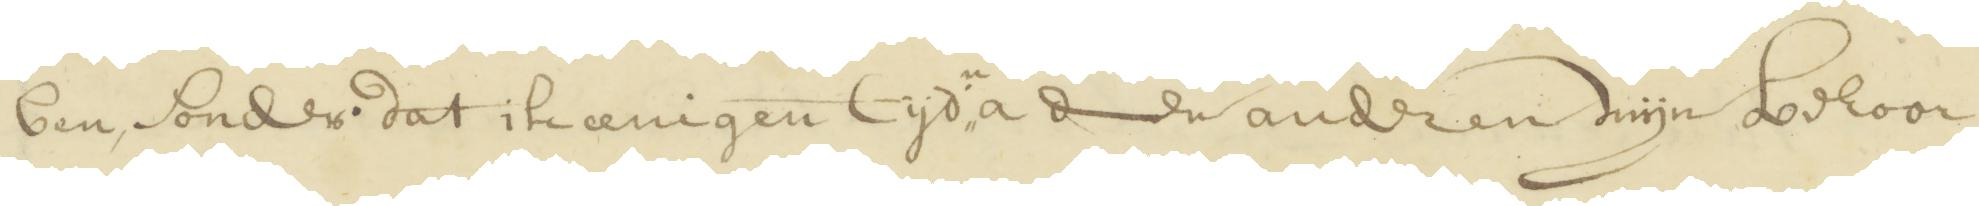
ben, Sonder dat ik eenigen tijd„na den anderen mijn behoor
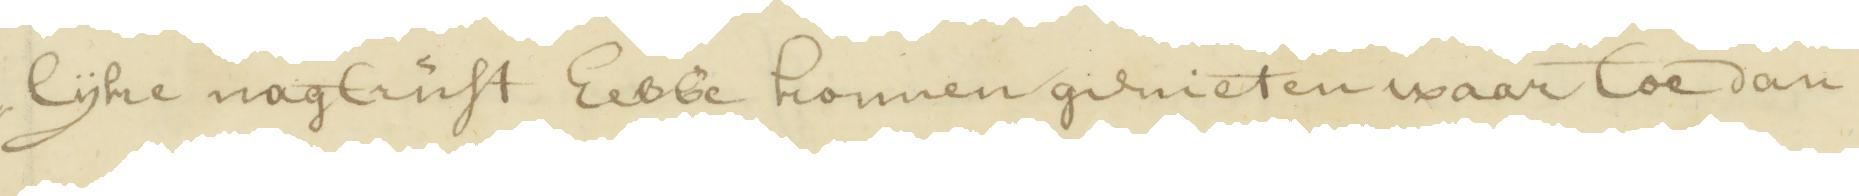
„lijke nagtrust hebbe konnen genieten waar toe dan
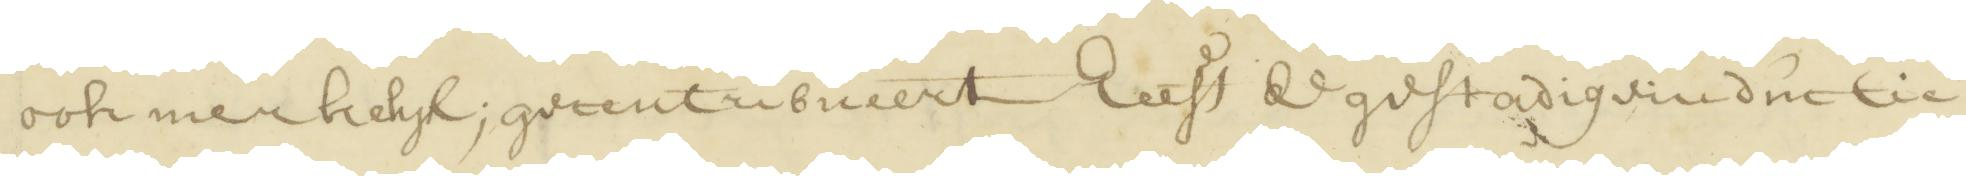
ook merkelyk; gecentribueert heeft de gestadige inductie
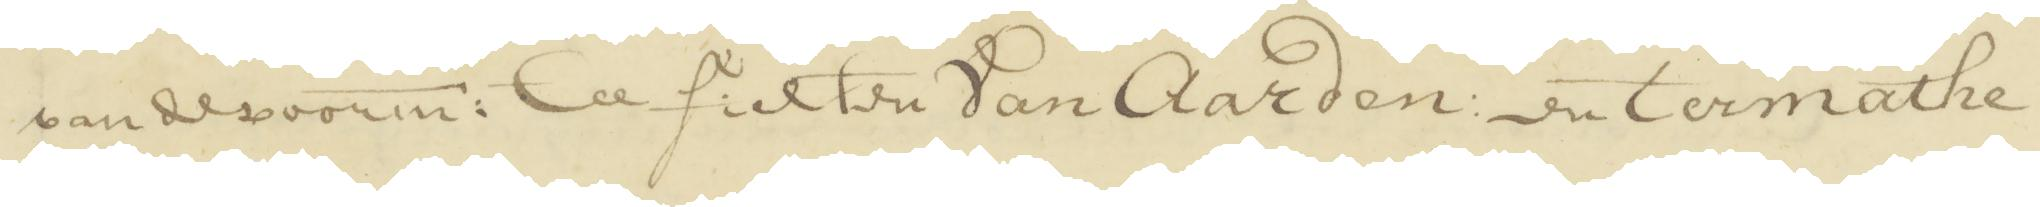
van de voorm: Cee Pieter van Aarden: en termathe
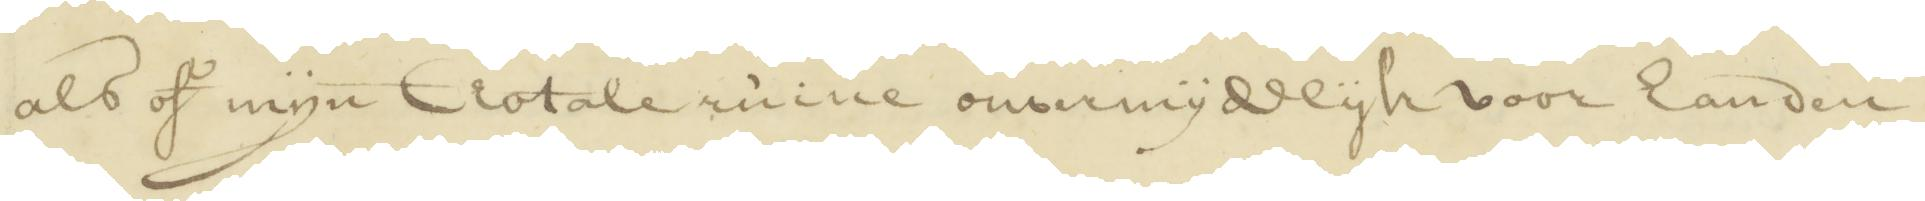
als of mijn thotale ruine onvermijdelijk voor handen
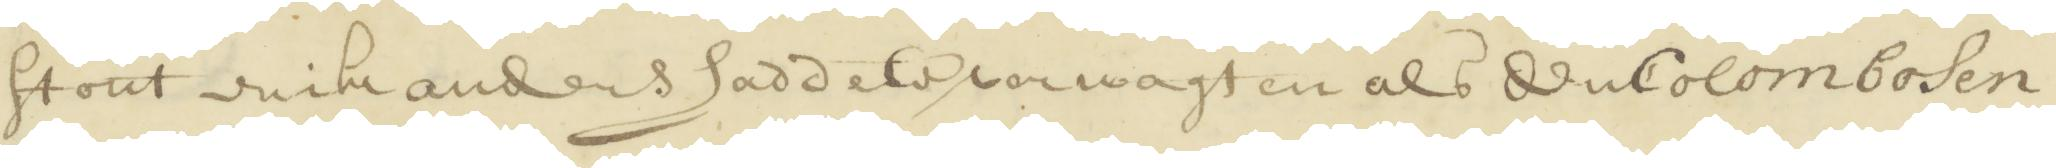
stont en ik anders hadde te verwagten als den Colombosen
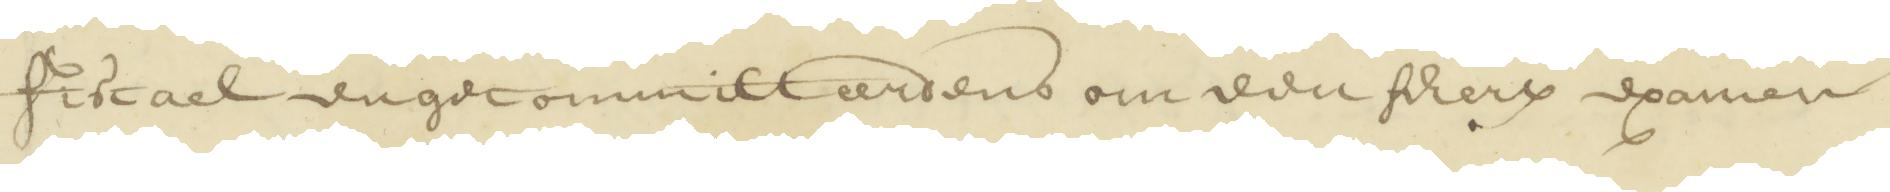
fiscael en gecommitteerdens om een scherp examen
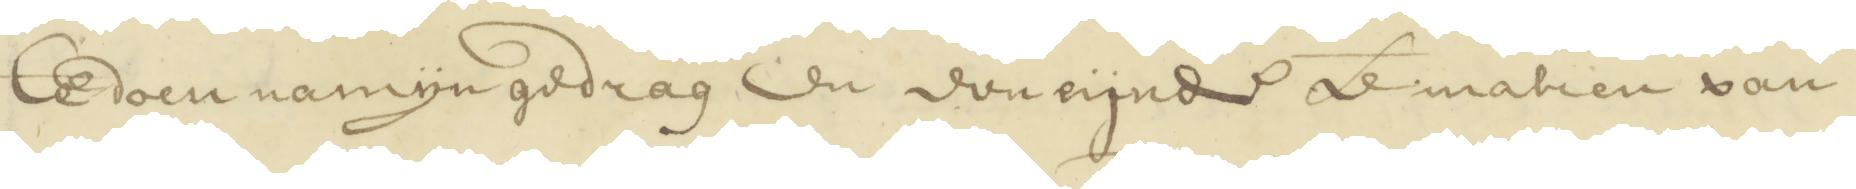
te doen na mijn gedrag en een eijnde te maken van
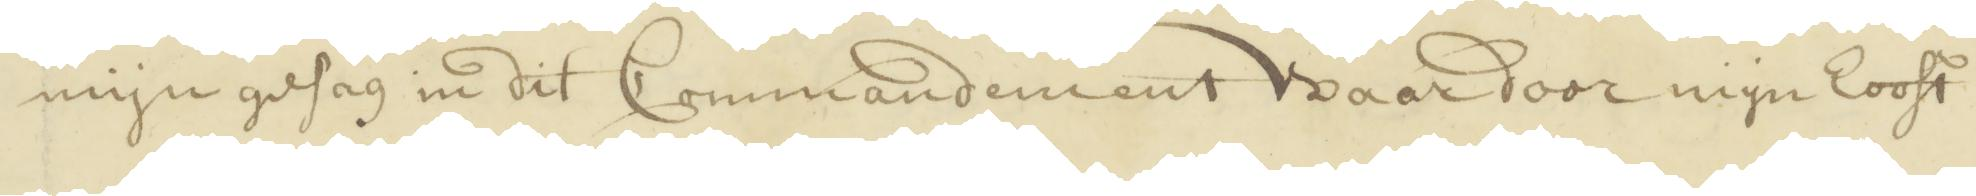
mijn gesag in dit Commandement waar door mijn hooft
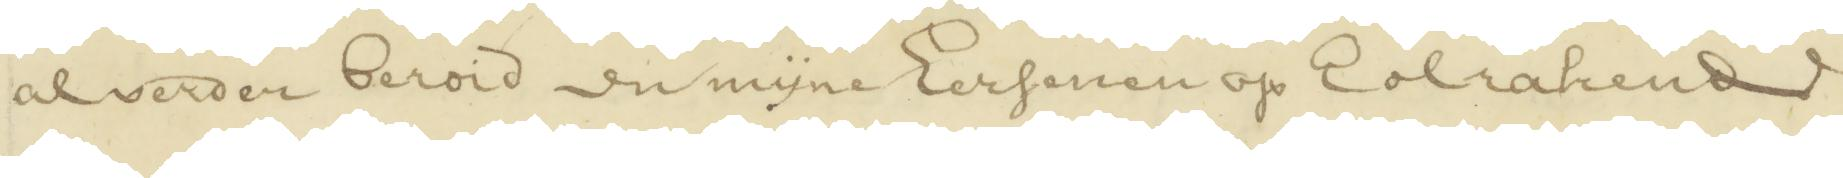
al verder beroid en mijne hersenen op hol rakende
